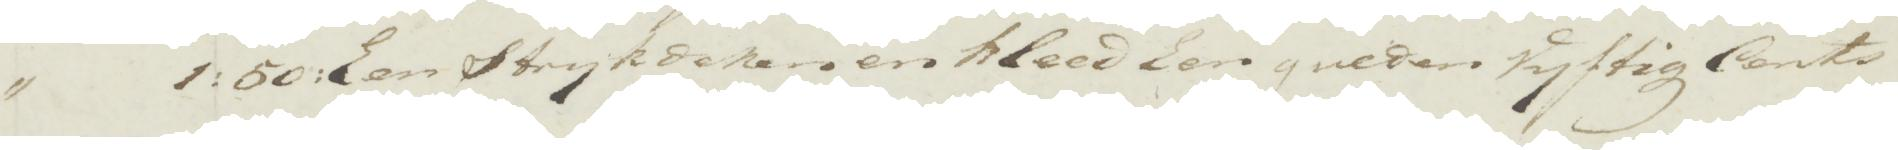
„ 1: 50: Een strijkdeken en kleed Een qulden vyftig Cents
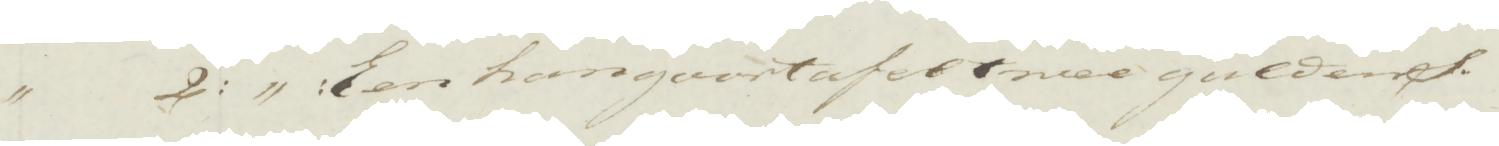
„ 2: „: Een hangoortafel twee guldens.
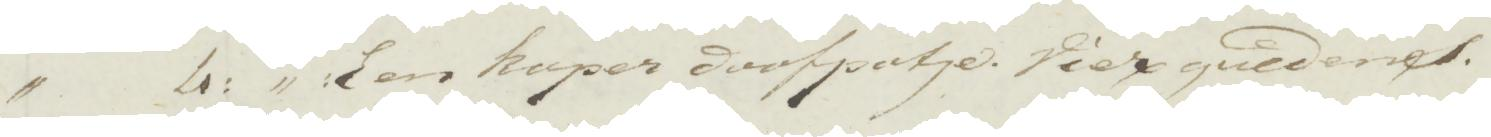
„ 4: „: Een koper doofpotje Vier guldens.
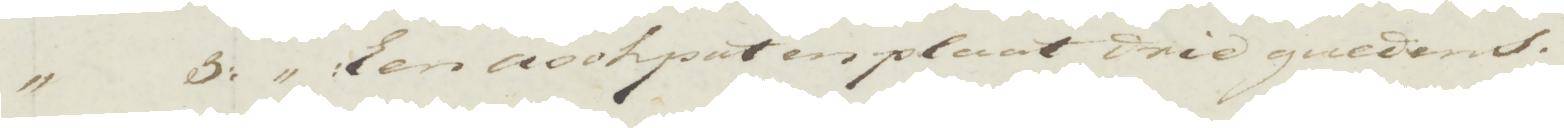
„ 3: „: Een aschput en plaat drie guldens.
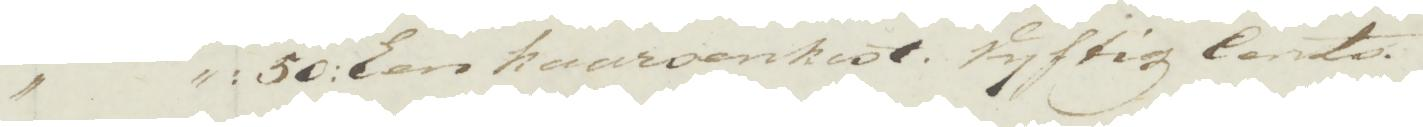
„ „: 50: Een haarvenkist Vijftig Cents.
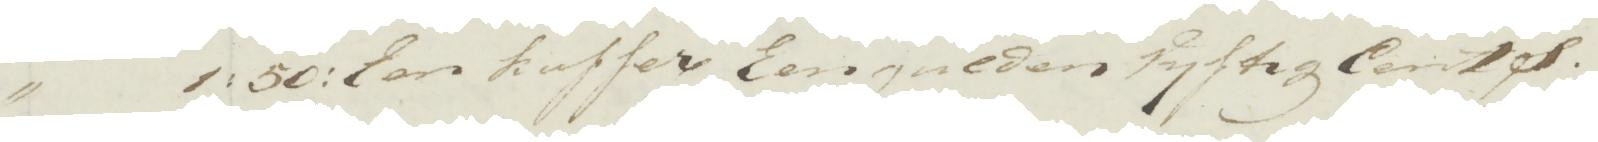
„ 1: 50: Een koffer Een gulden vijftig Cents.
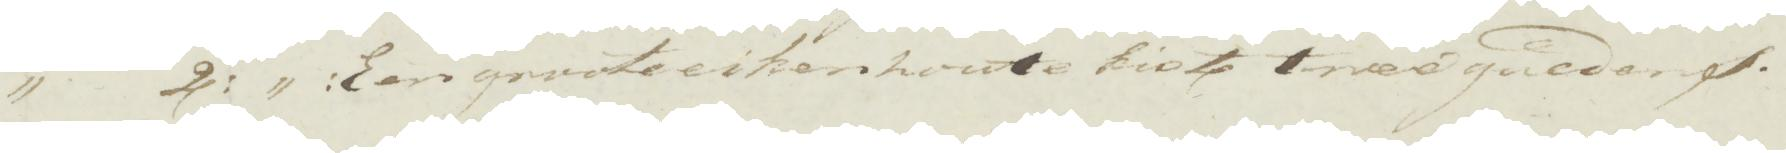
„ 2: „: Een groote eikenhoute kist twee guldens.
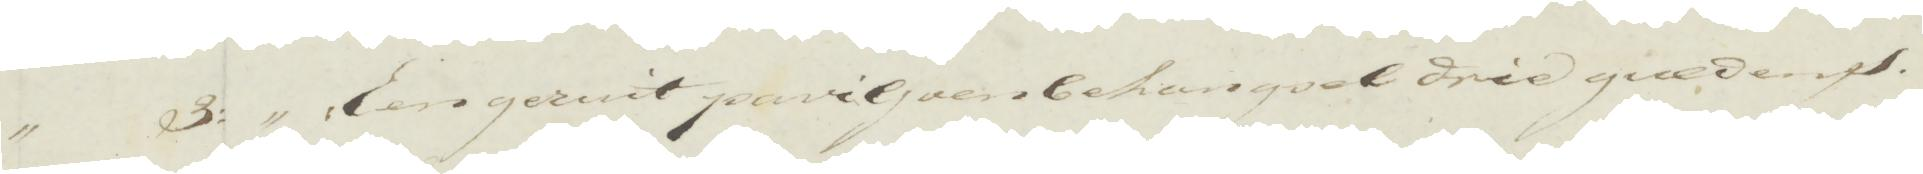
„ 3: „: Een geruit paviljoen behangsel drie guldens.
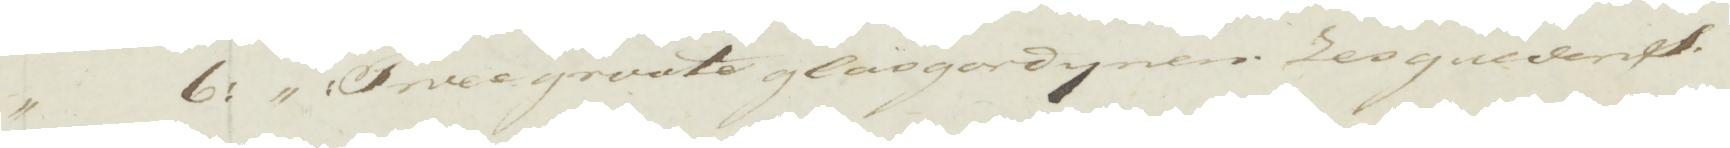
„ 6: „: Twee groote glasgordynen zes guldens.
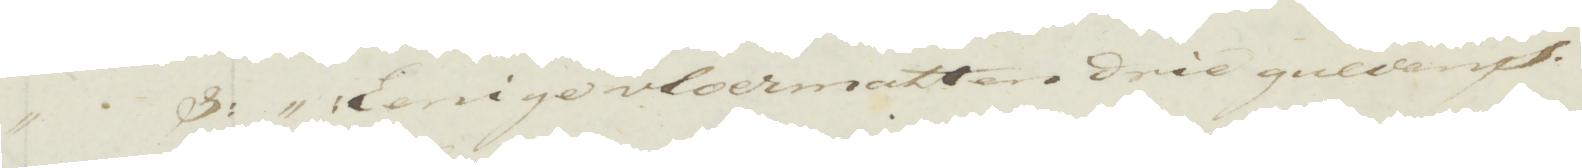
„ 3: „: Eenige vloermatten drie guldens
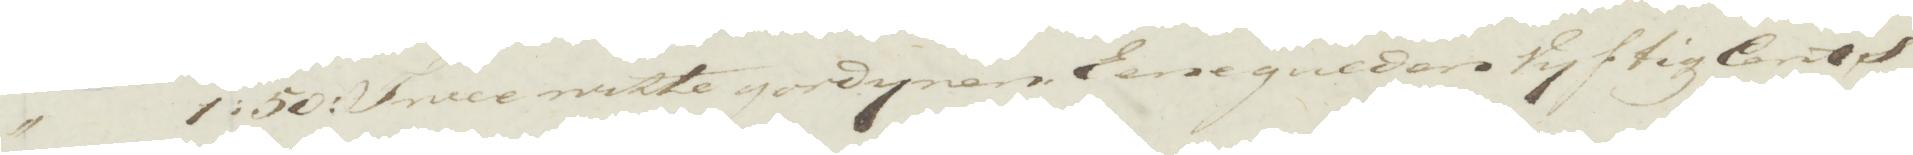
„ 1: 50: Twee witte gordijnen een gulden vyftig Cents
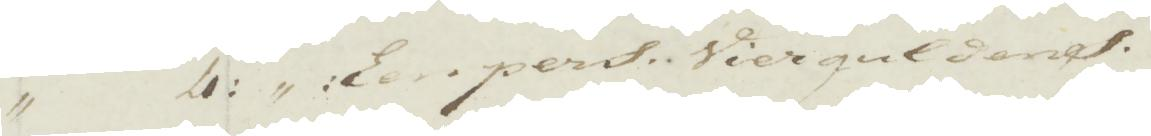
„ 4: „: Een pers.. Vier guldens
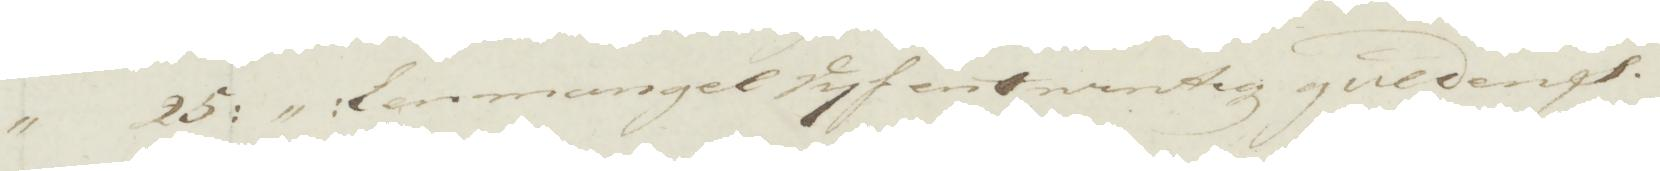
„ 25: „: Een mangel vijf en twintig guldens.
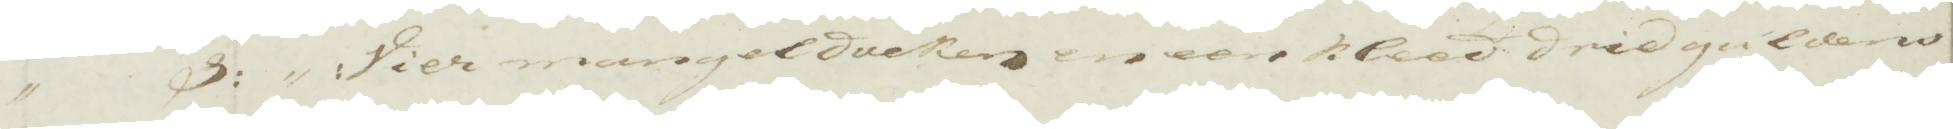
„ 3: „: Vier mangeldoeken en een kleed drie guldens
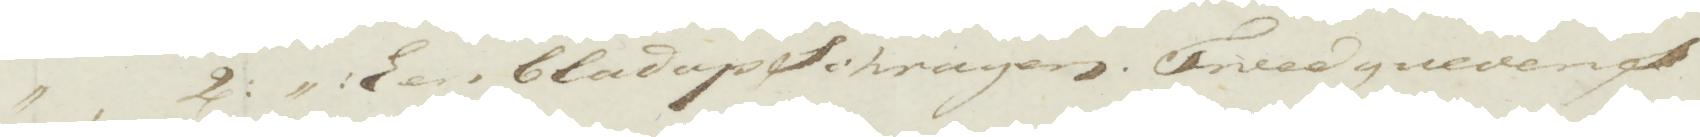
„ 2: „: Een bladop Schragen Twee guldens
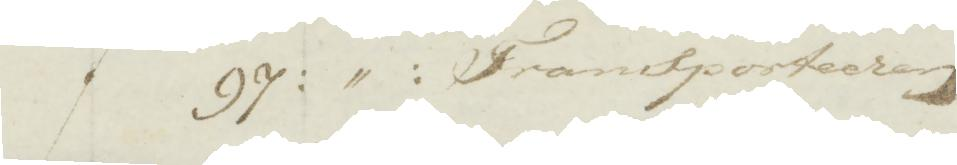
ƒ 97: „: Transporteeren.
